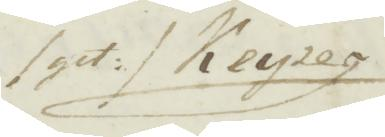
/get:/ Keyzer
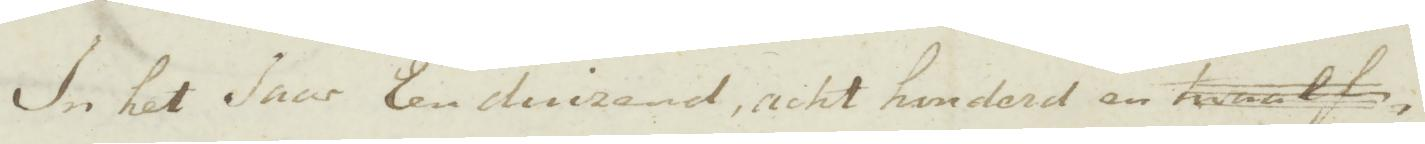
In het Iaar Een duizend, acht honderd en twaalf
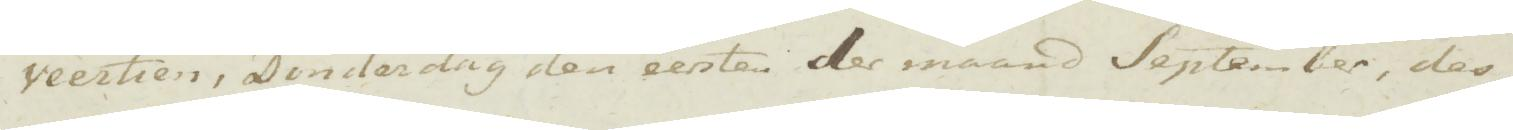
veertien, Donderdag den eersten der maand September, des
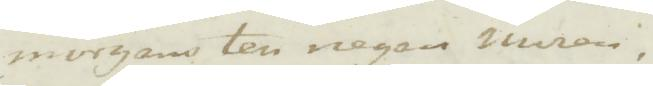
morgens ten negen uuren,
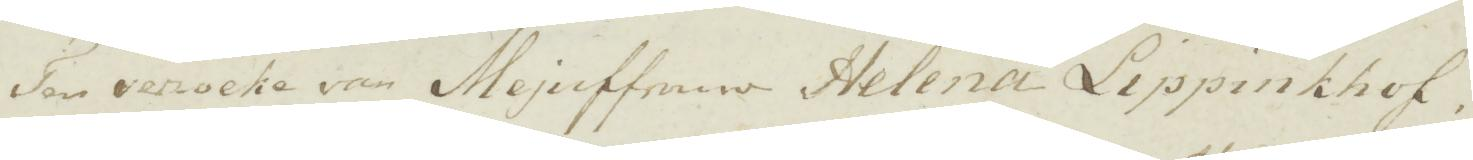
Ten verzoeke van Mejuffrouw Helena Lippinkhof,
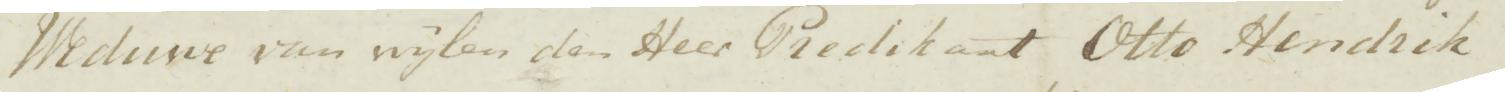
Weduwe van wijlen den Heer Predikant Otto Hendrik
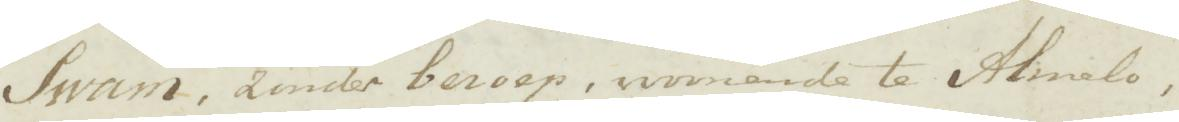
Swam, zonder beroep, woonende te Almelo,
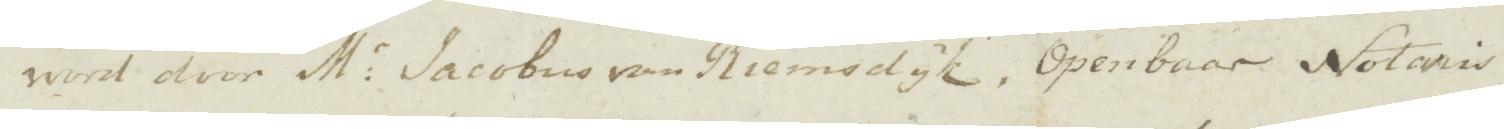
word door M:r Iacobus van Riemsdijk, Openbaar Notaris
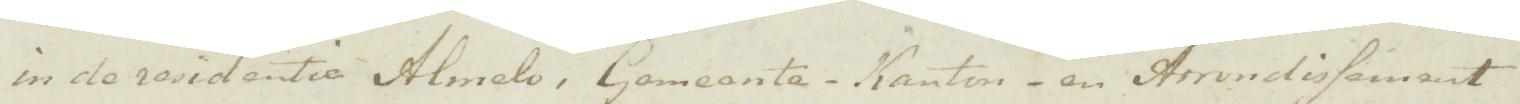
in de residentie Almelo, Gemeente - Kanton - en Arrondissement
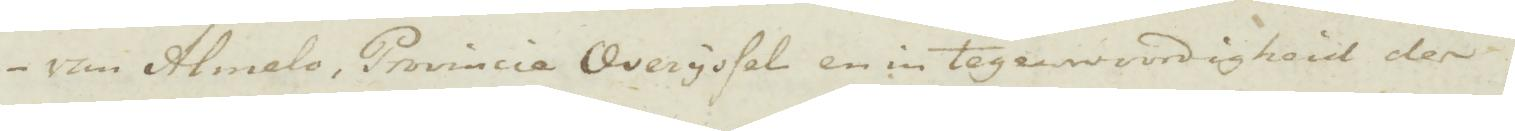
-van Almelo, Provincie Overijssel en in tegenwoordigheid der
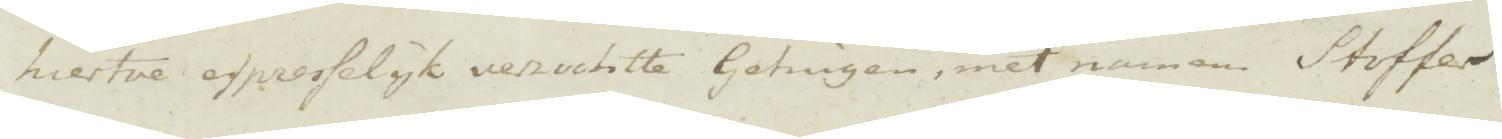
hiertoe expresselijk verzochtte Getuigen, met namen Stoffer
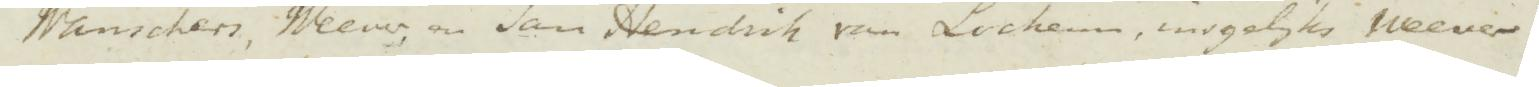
Wanschers, Weever en Ian Hendrik van Lochem, insgelijks weever,
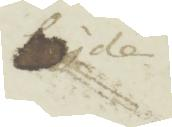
bijde
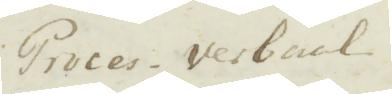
Proces- verbaal
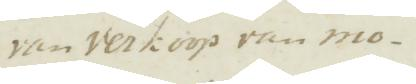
van verkoop van mo-
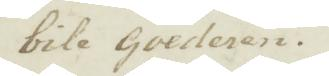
bile Goederen.
